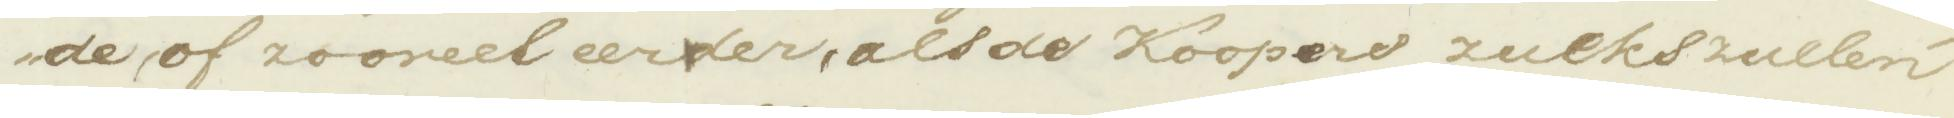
„de, of zooveel eerder, als de Koopers zulks zullen
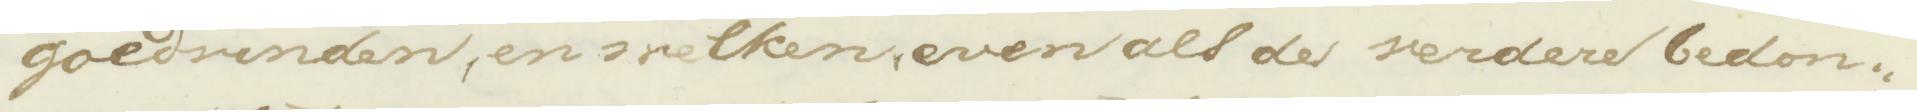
goedvinden, en welken, even als de verdere bedon„
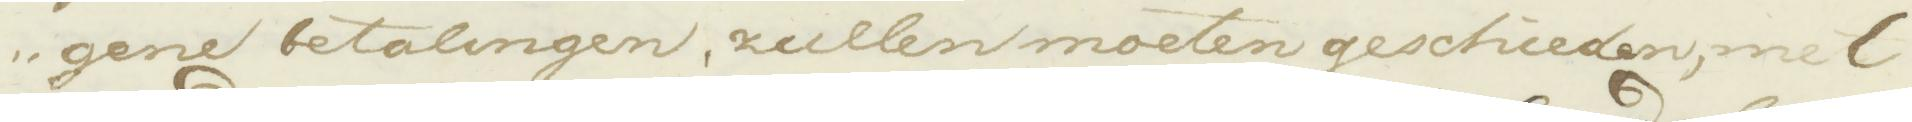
„gene betalingen, zullen moeten geschieden, met
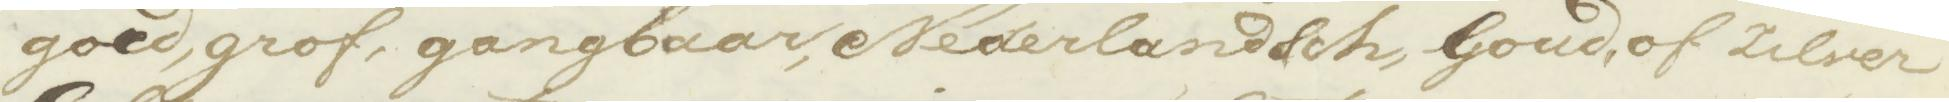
goed, grof, gangbaar Nederlandsch, Goud, of zilver
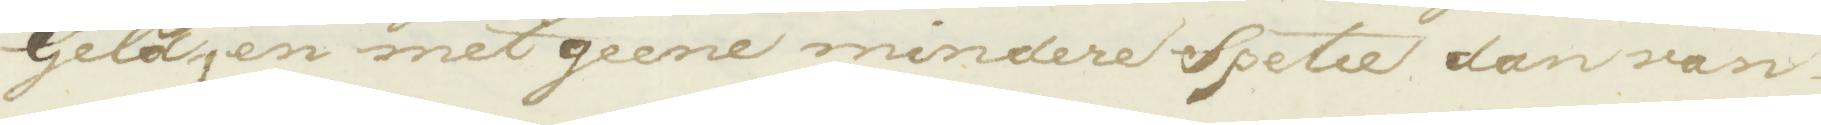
Geld, en met geene mindere spetie dan van
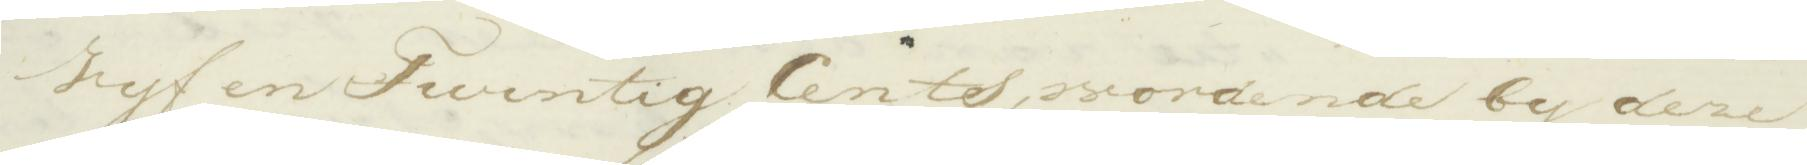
Vyf en Twintig Cents, wordende by deze
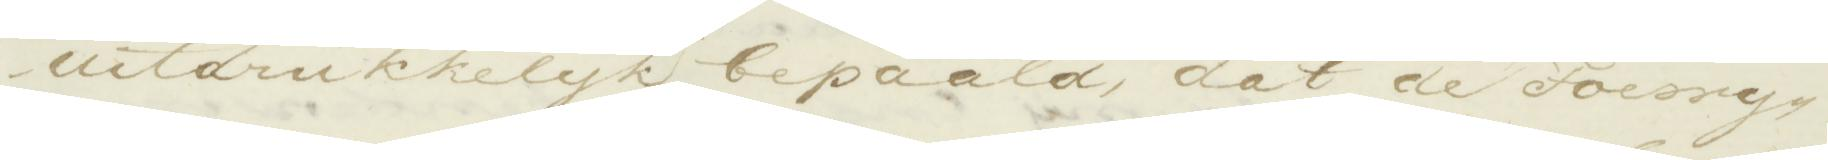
uitdrukkelyk bepaald, dat de Toewy„
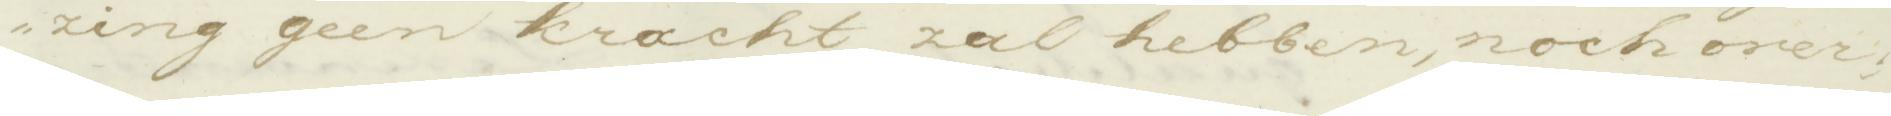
„ring geen kracht zal hebben, noch over„
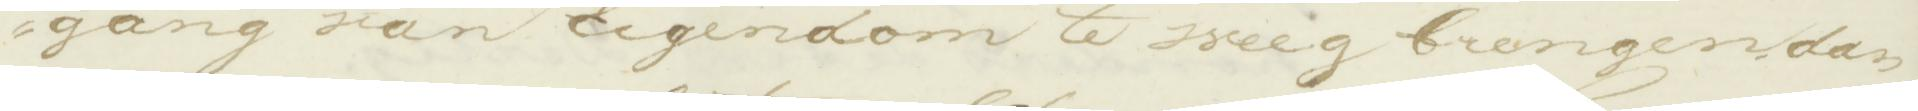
„gang van Eigendom te weeg brengen dan
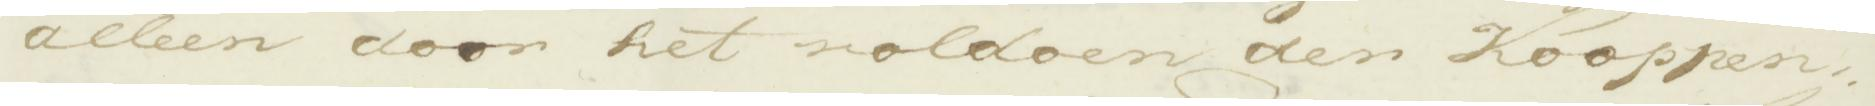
alleen door het voldoen der Kooppen,
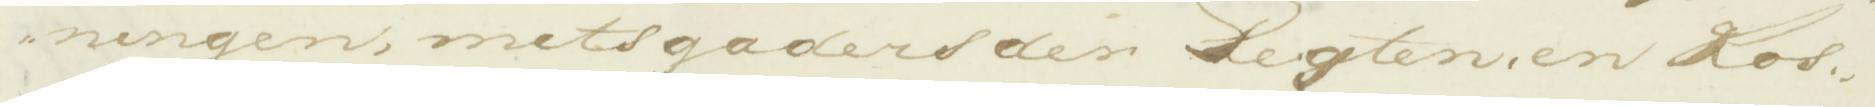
„ningen, mitsgaders den Regten, en Kos
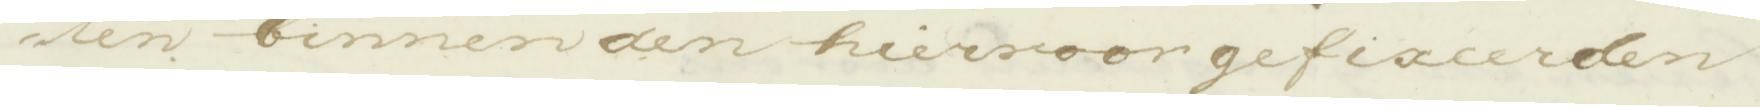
ten binnen den hiervoor gefixeerden
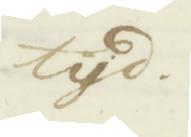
tijd.
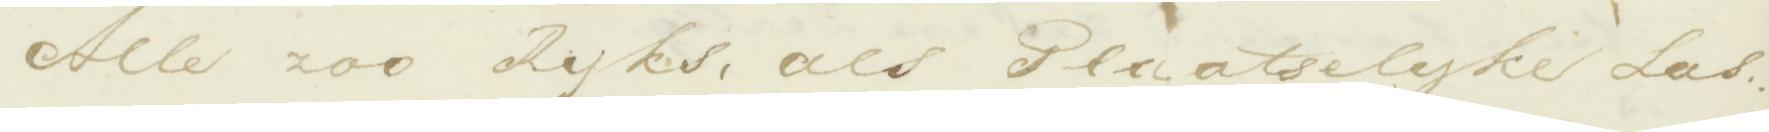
Alle zoo Rijks, als Plaatselyke Las„
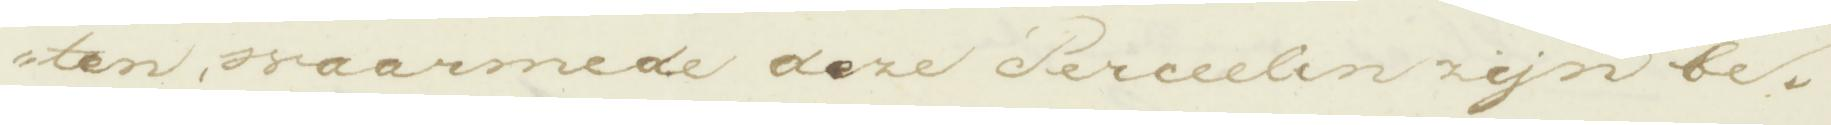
„ten, waarmede deze Perceelen zijn be„
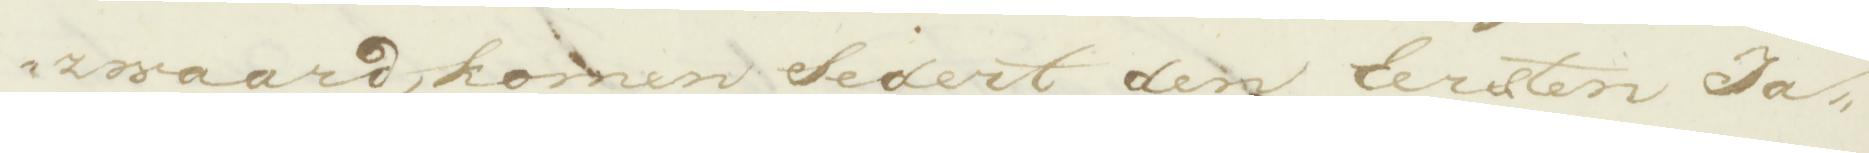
„zwaard, komen sedert den Eersten Ia„
